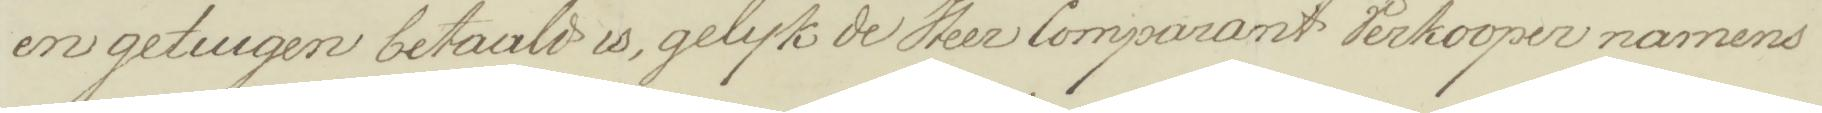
en getuigen betaald is, gelyk de Heer Comparant Verkooper namens
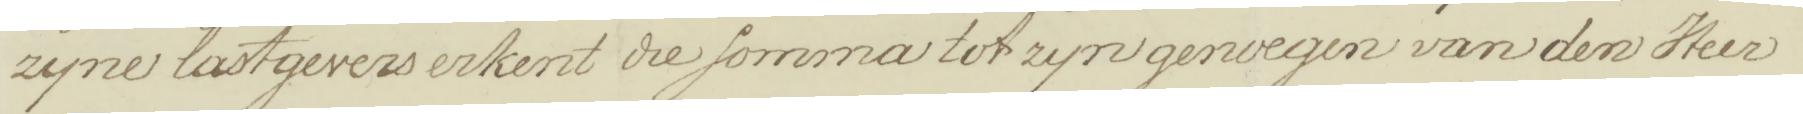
zyne lastgevers erkent die somma tot zyn genoegen van den Heer
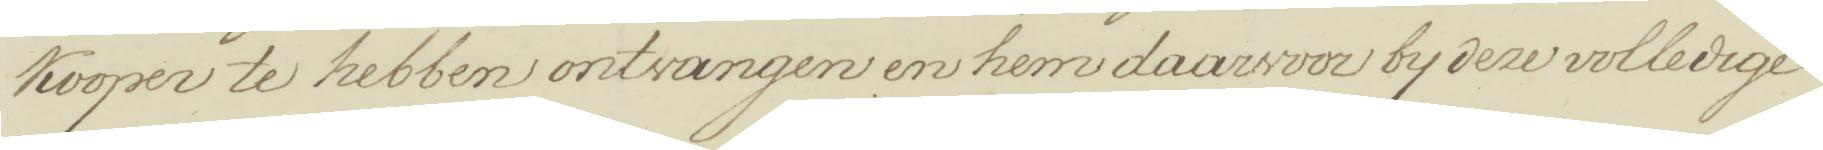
kooper te hebben ontvangen en hem daarvoor by deze volledige
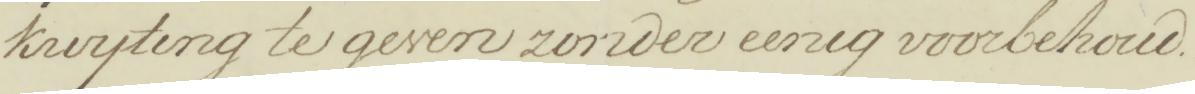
kwyting te geven zonder eenig voorbehoud.
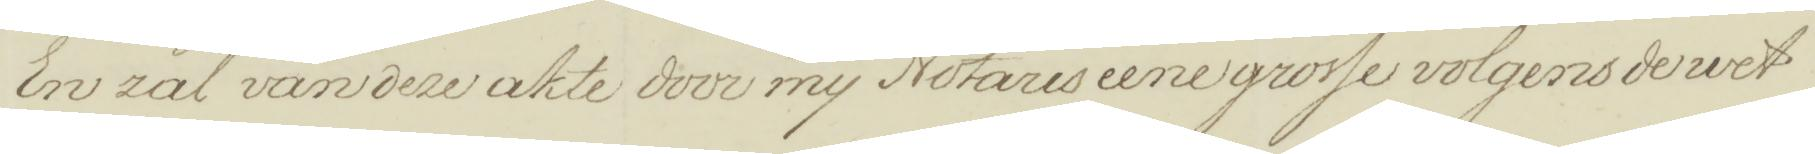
En zal van deze akte door my Notaris eene grosse volgens de wet
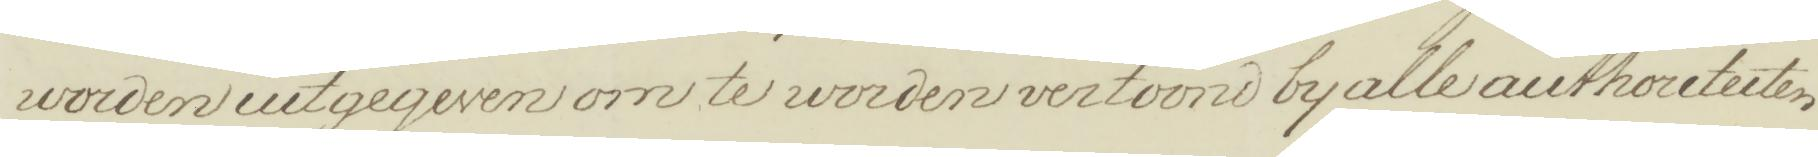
worden uitgegeven om te worden vertoond by alle authoriteiten
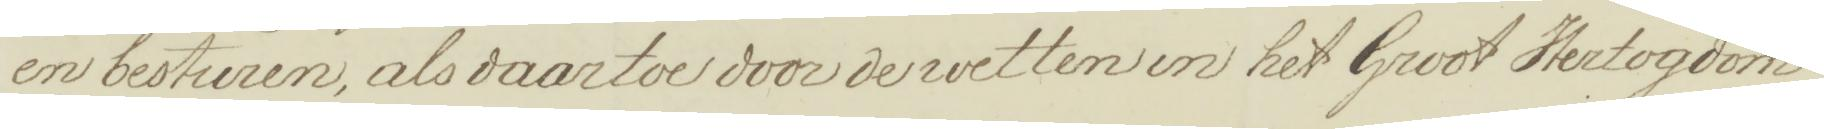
en besturen, als daartoe door de wetten in het Groot Hertogdom
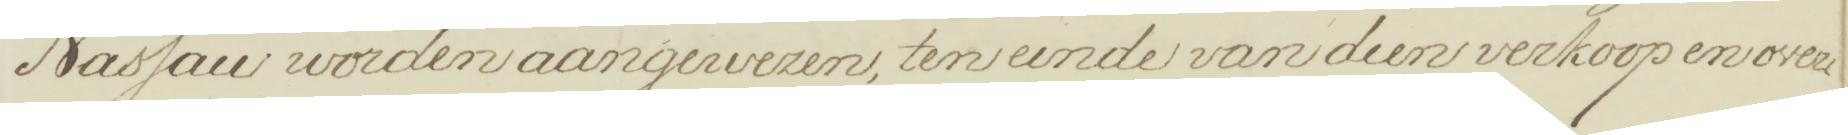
Nassau worden aangewezen, ten einde van dien verkoop en over
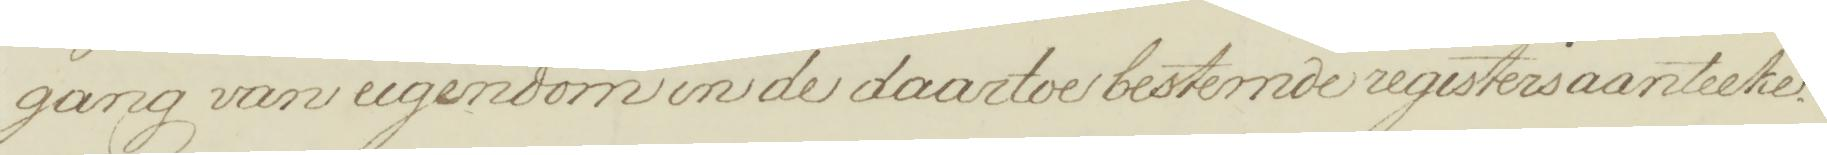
gang van eigendom in de daartoe bestemde registers aanteeke„
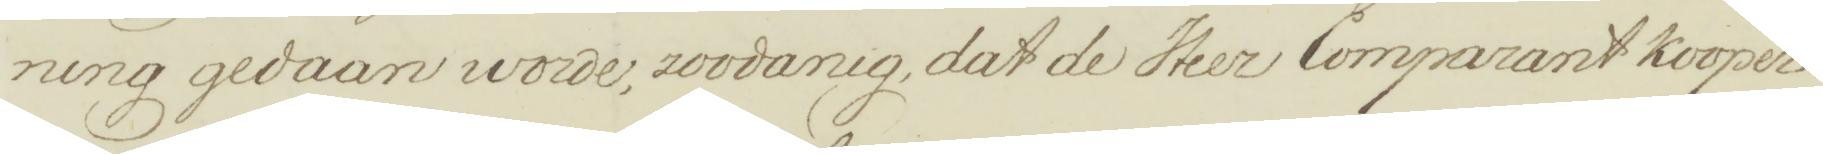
ning gedaan worde, zoodanig, dat de Heer Comparant kooper
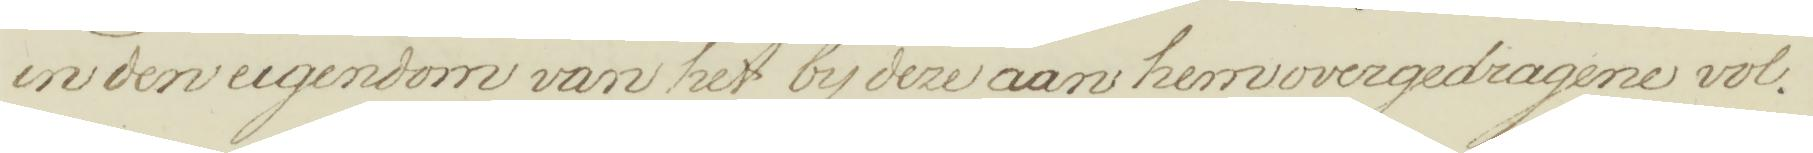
in den eigendom van het by deze aan hem overgedragene vol„
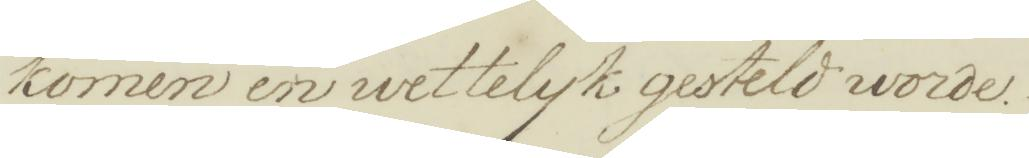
komen en wettelyk gesteld worde.
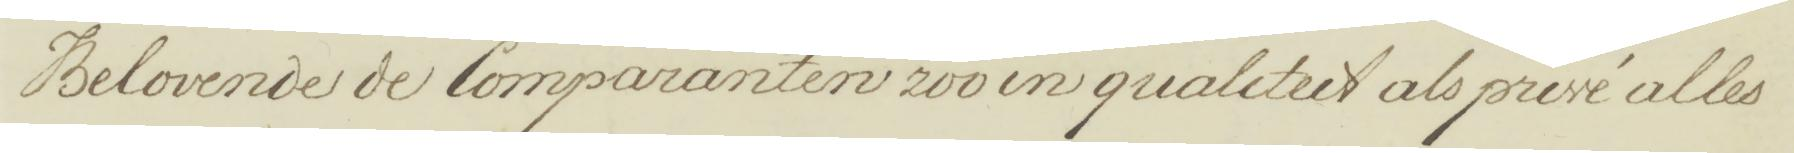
Belovende de Comparanten zoo in qualiteit als privé alles
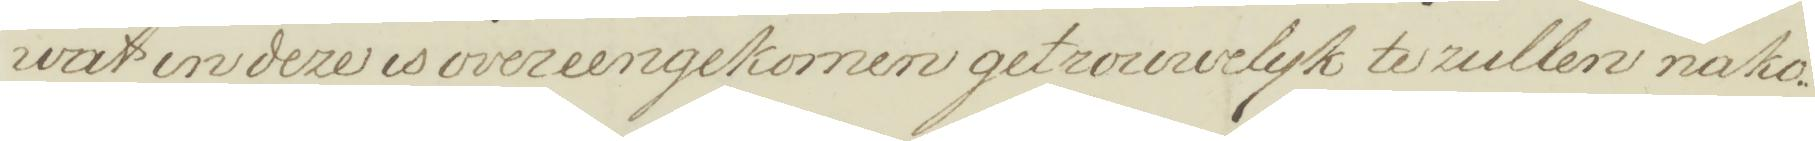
wat in deze is over eengekomen getrouwelyk te zullen na ko„
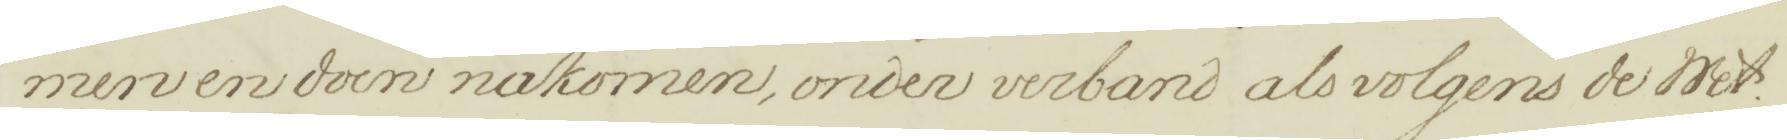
men en doen nakomen, onder verband als volgens de Wet„
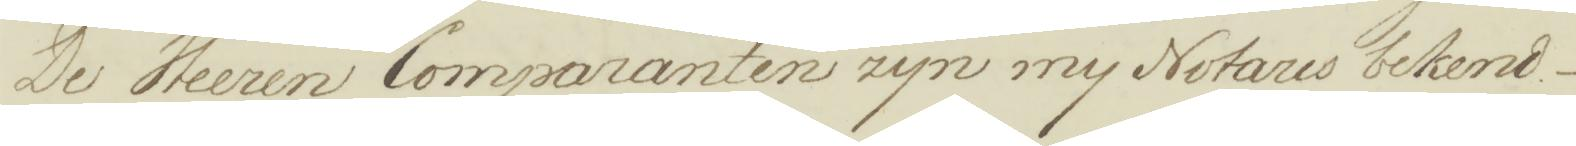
De Heeren Comparanten zyn my Notaris bekend.-
